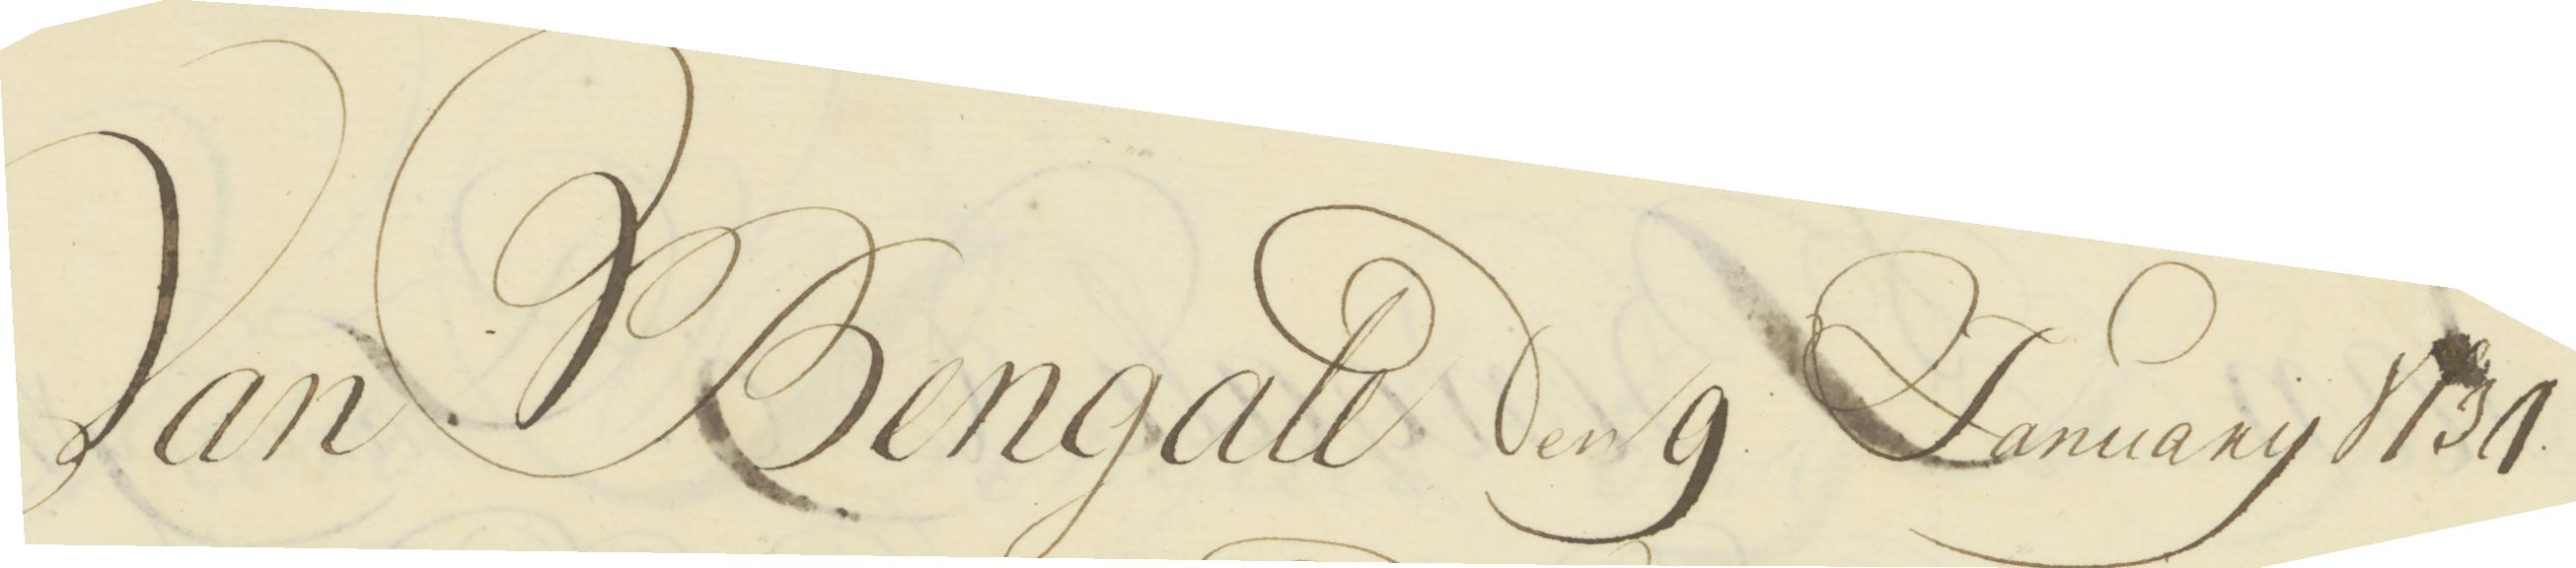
Van Bengale den 9:' Ianuarij 1734.
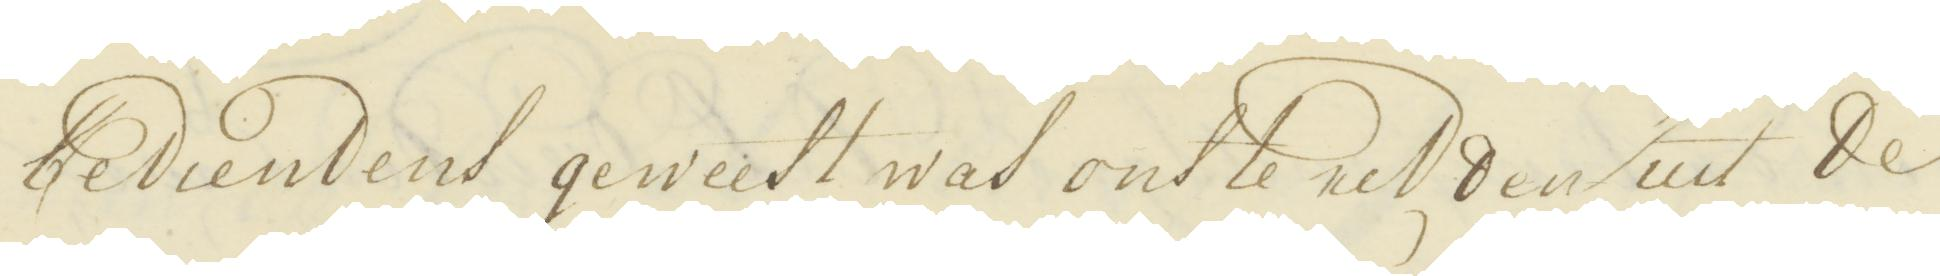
bediendens geweest was ons te redden uit de
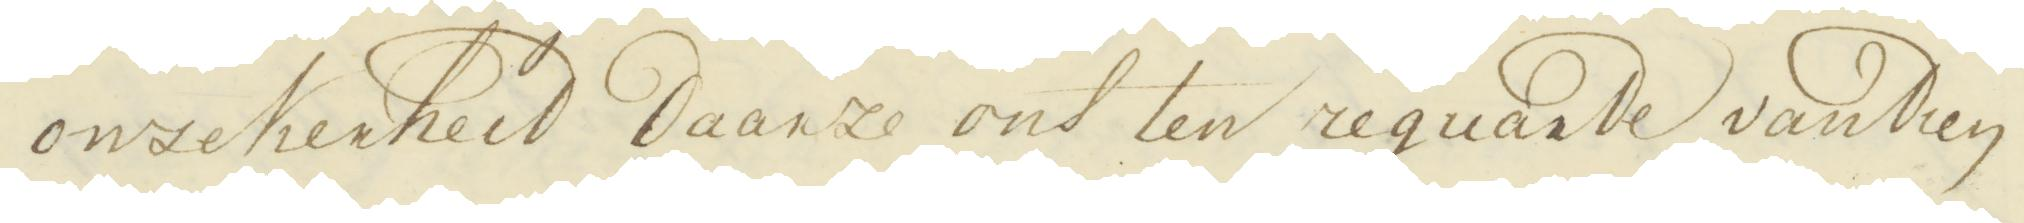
onsekerheid daar ze ons ten reguarde van dien
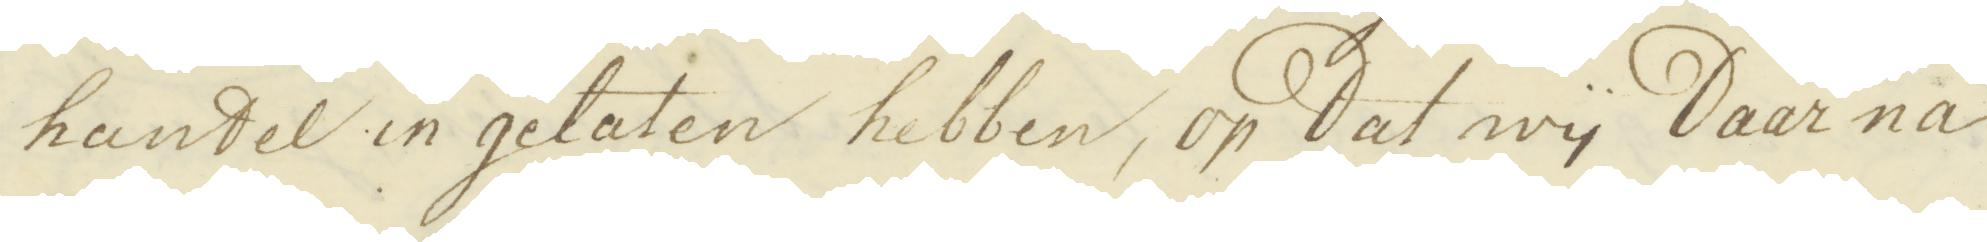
handel in gelaten hebben, op dat wij Daar na
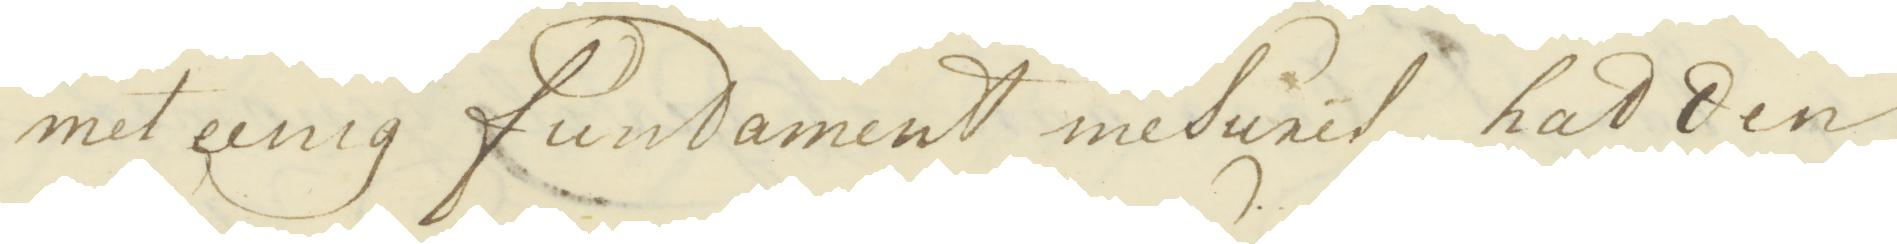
met eenig fundament mesures hadden
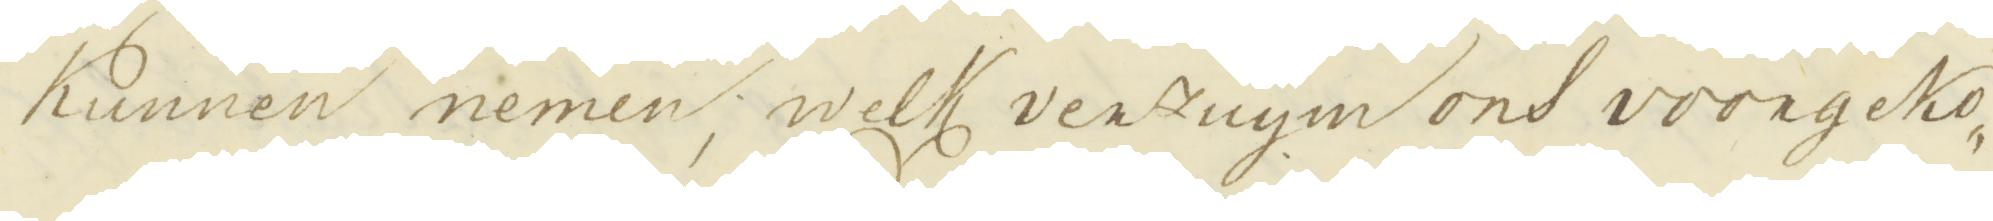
Kunnen nemen, welk verzuijm ons voorgeko„
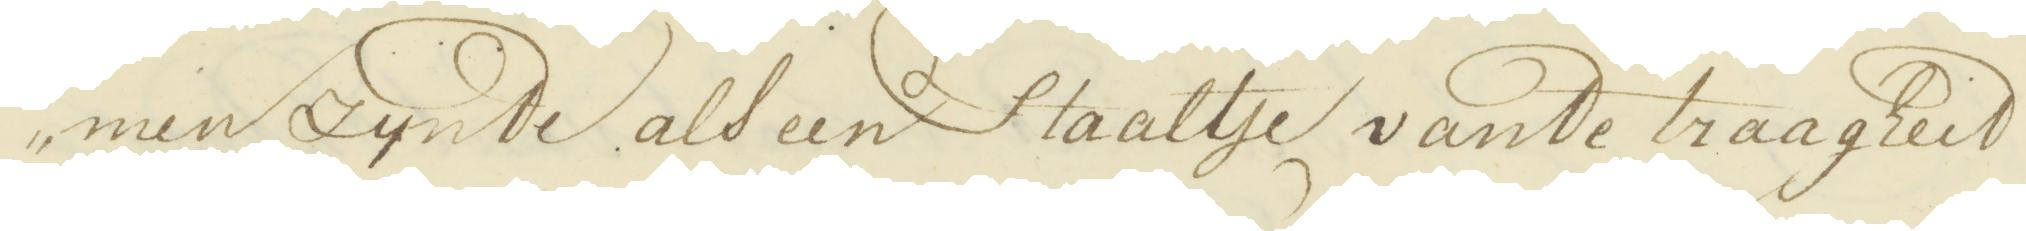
„min Zynde als een Staaltje van de traagheid
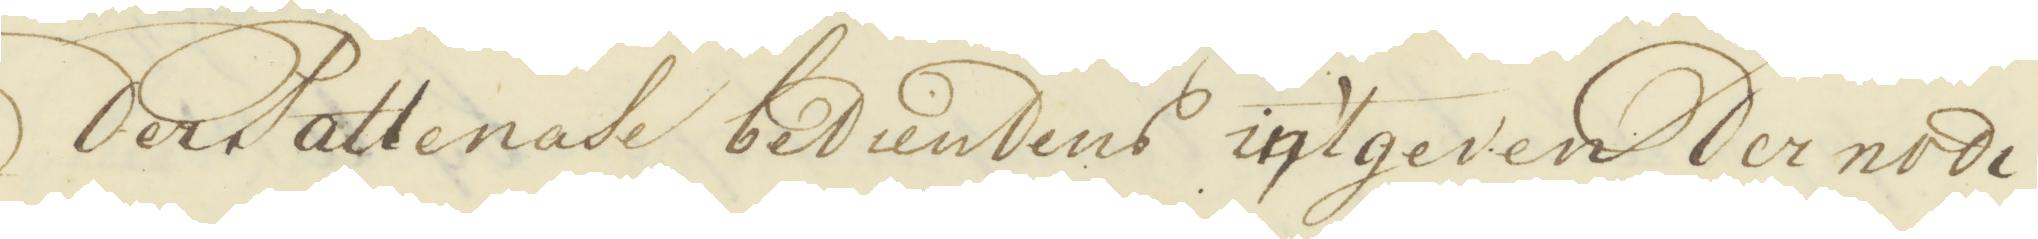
der Pattenase bediendens in't geven der nodi
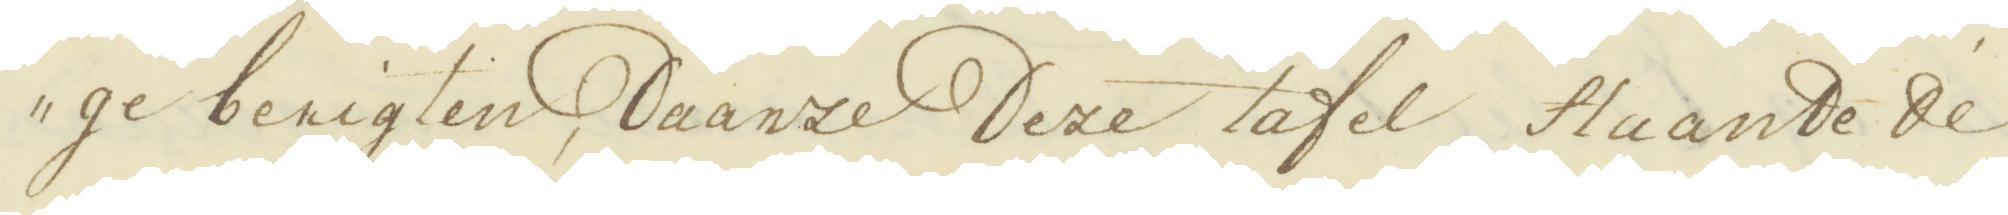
„ge berigten, Daar ze Deze tafel Staande de
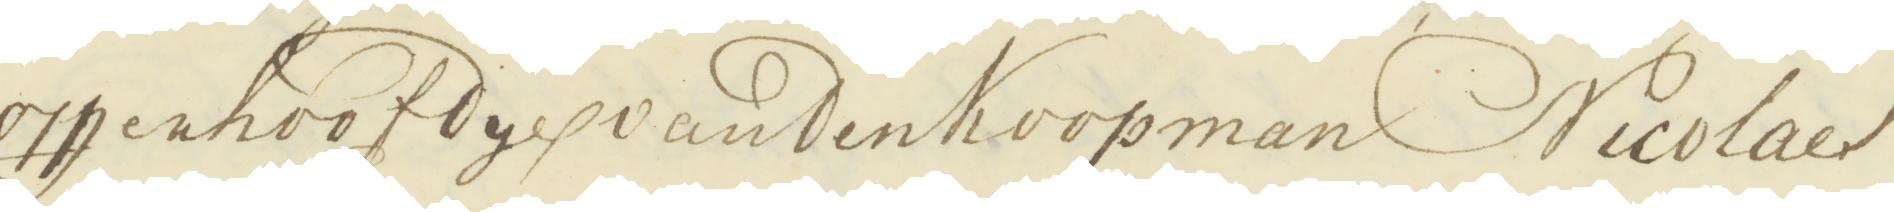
opperhoofdije van den Koopman Nicolaes
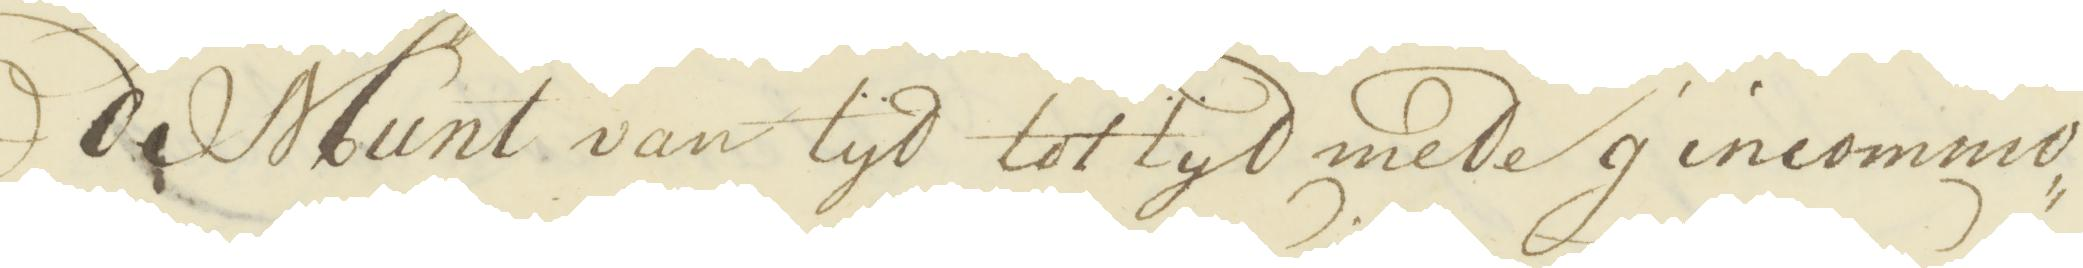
de Munt van tijd tot tijd mede g’incommo„
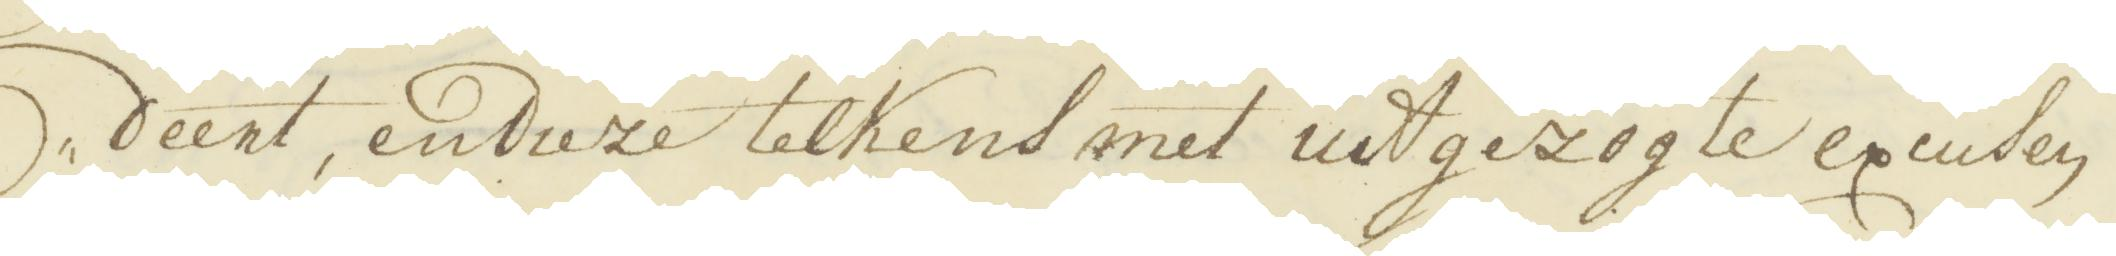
„deert, en die ze telkens met uitgezogte excusen
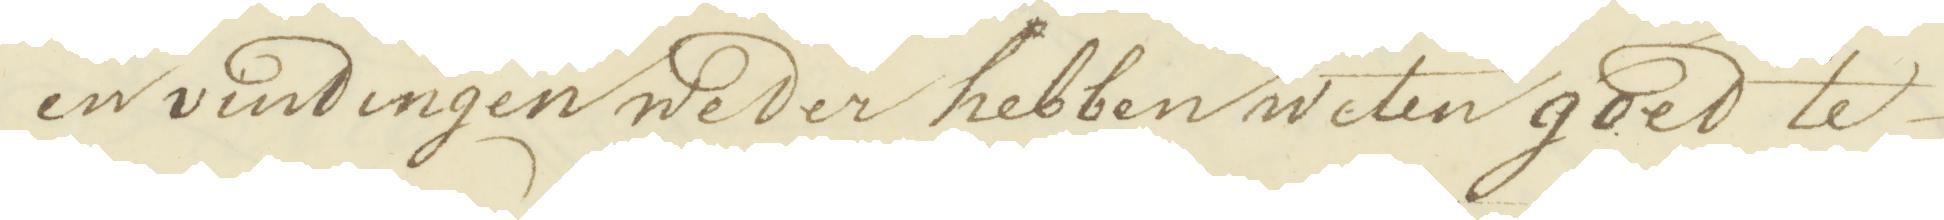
en vindingen weder hebben weten goed te
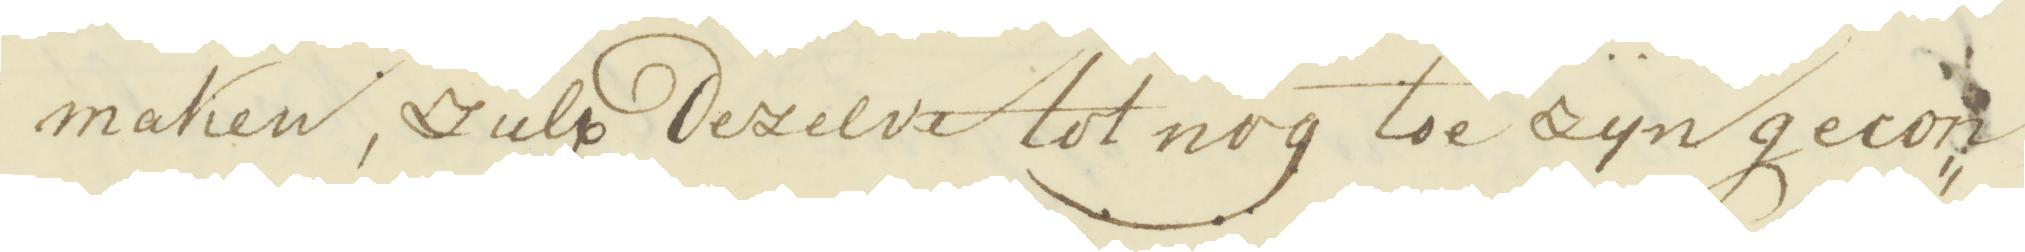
maken, zulx dezelve tot nog toe zijn gecon„
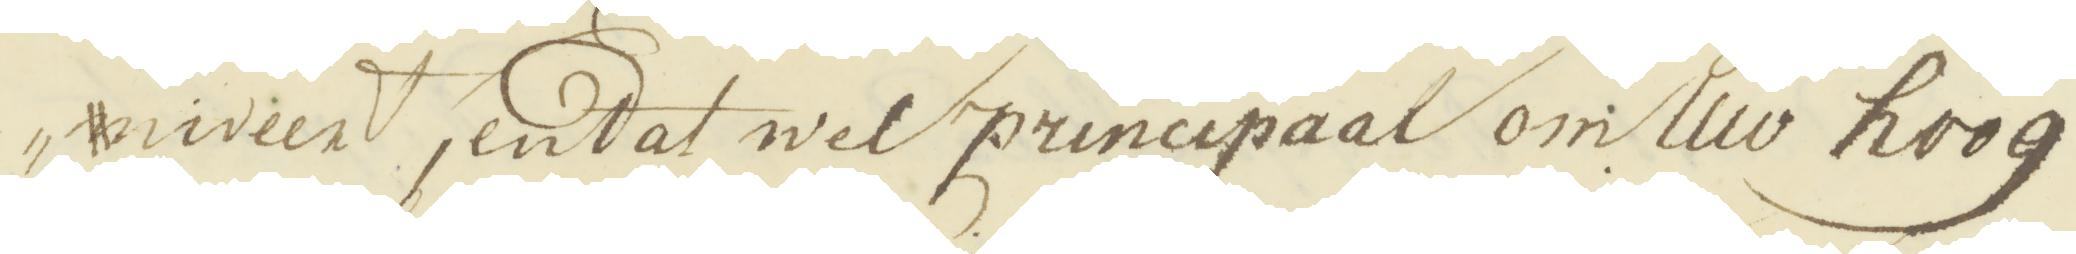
„niveer:t, en dat wel principaal om uw hoog
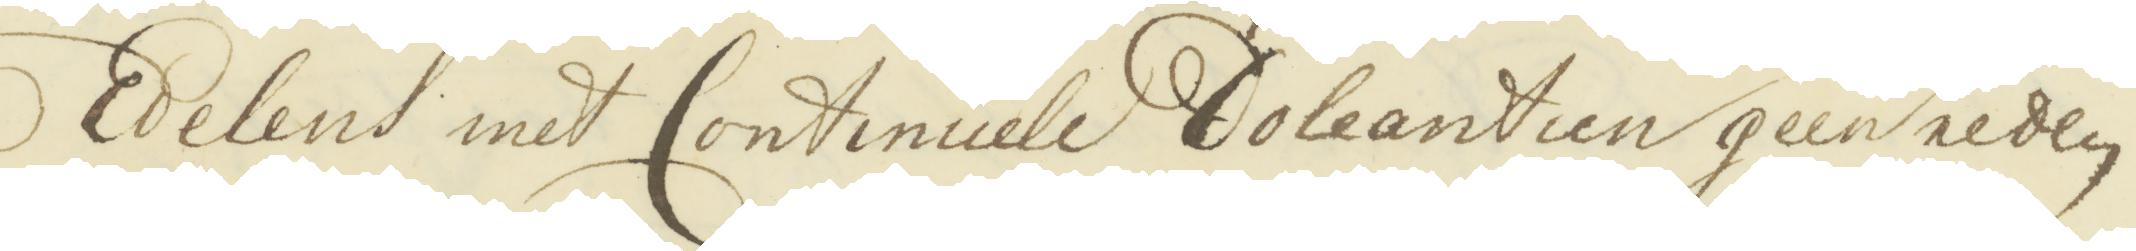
Edelens met Continuele doleantien geen reden
